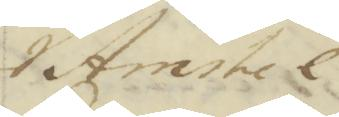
V Amstel
